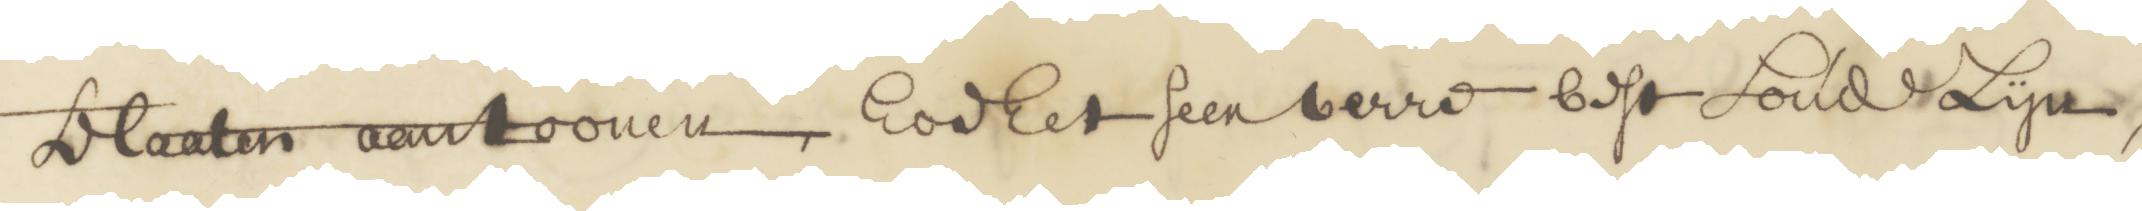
te laaten aantoonen hoe het seer verre best Soude Zijn,
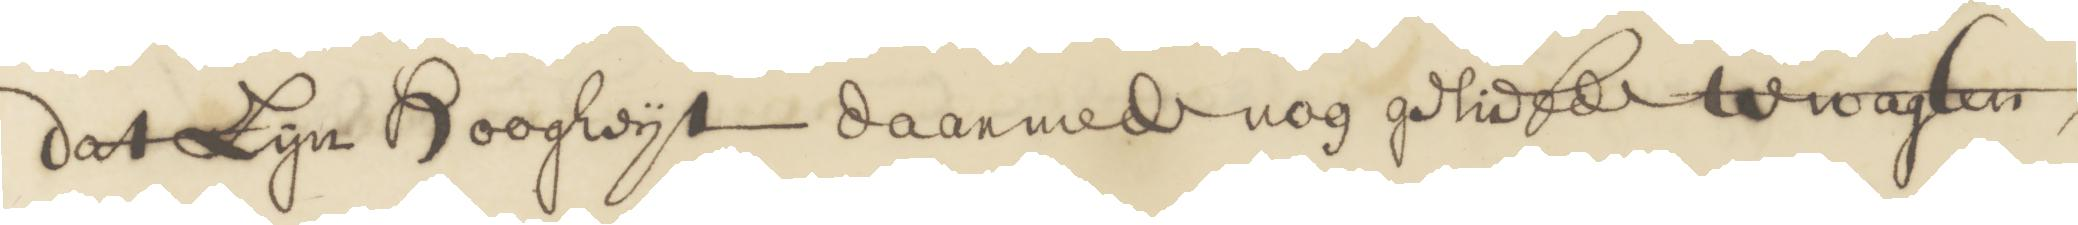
dat Zijn Hoogheijt daarmede nog geliefde te wagten
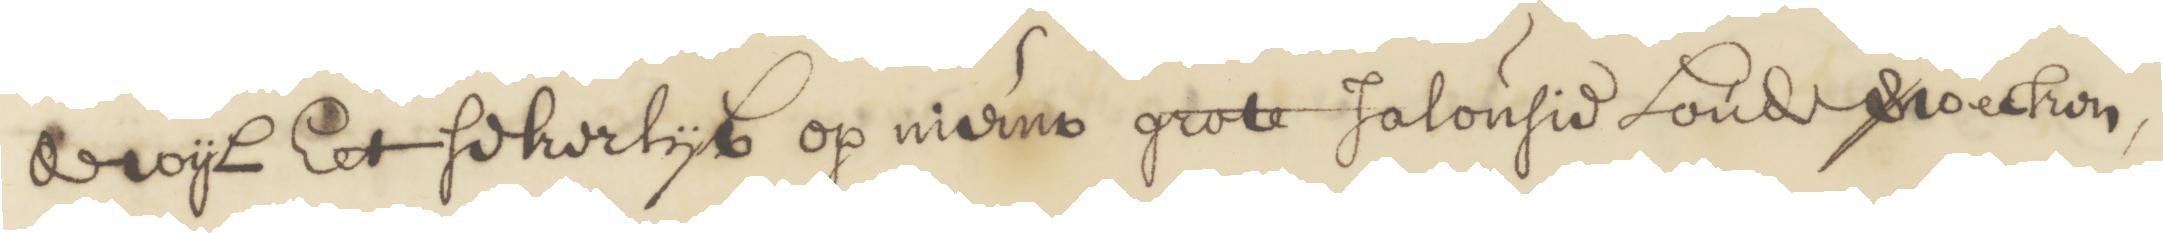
dewijl het sekerlijk op nieuw grote Jalousie Soude verwecken,
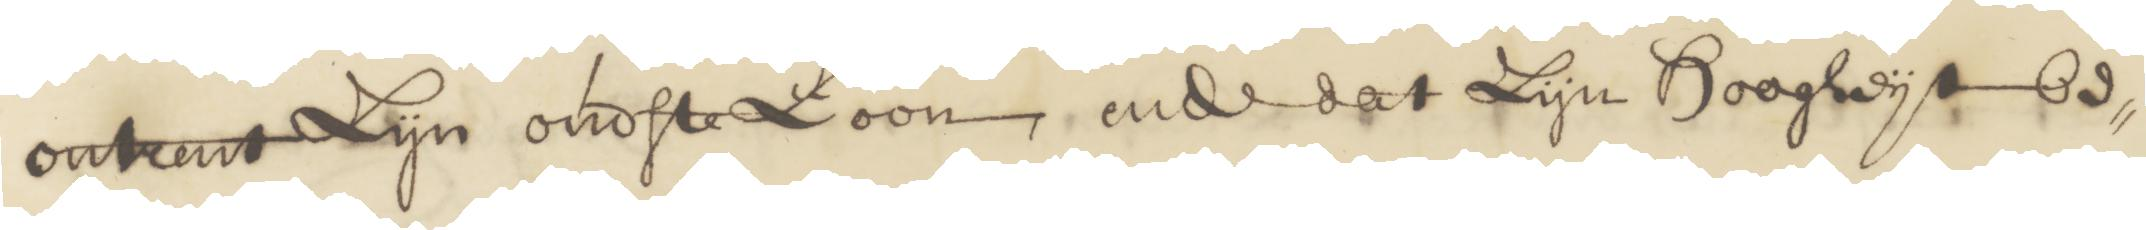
ontrent Zijn oudste Zoon, ende dat Zijn Hoogheijt be„
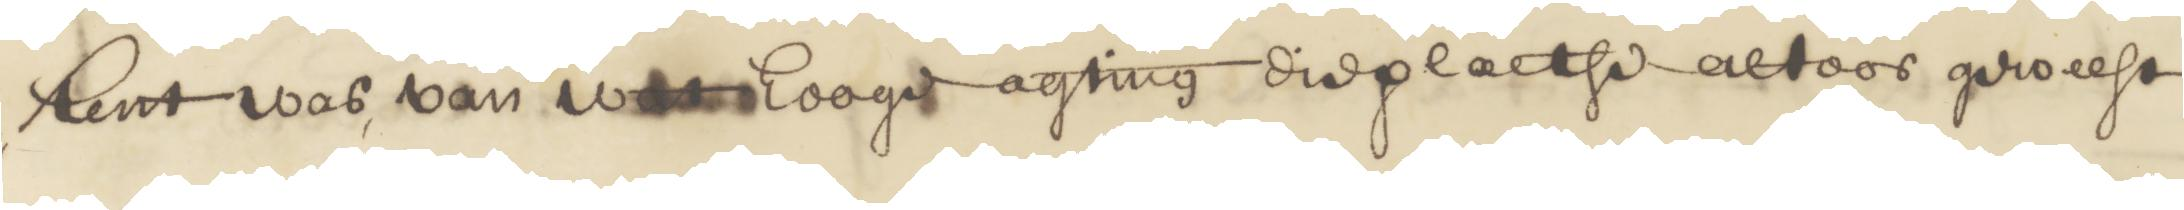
„kent was, van wat hooge agting die plaetse altoos geweest
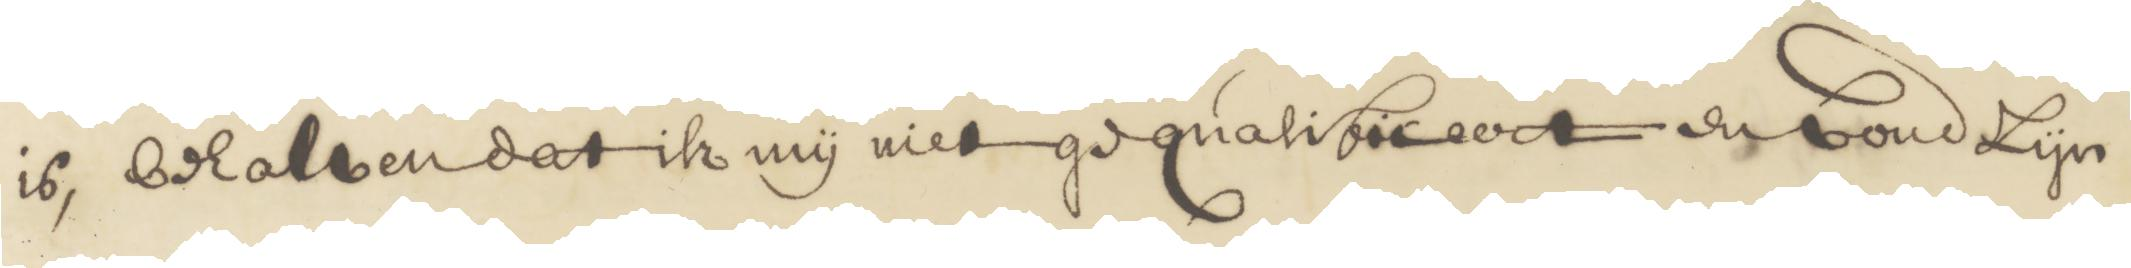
is, behalven dat ik mij niet gequalificeert en vond Zijn
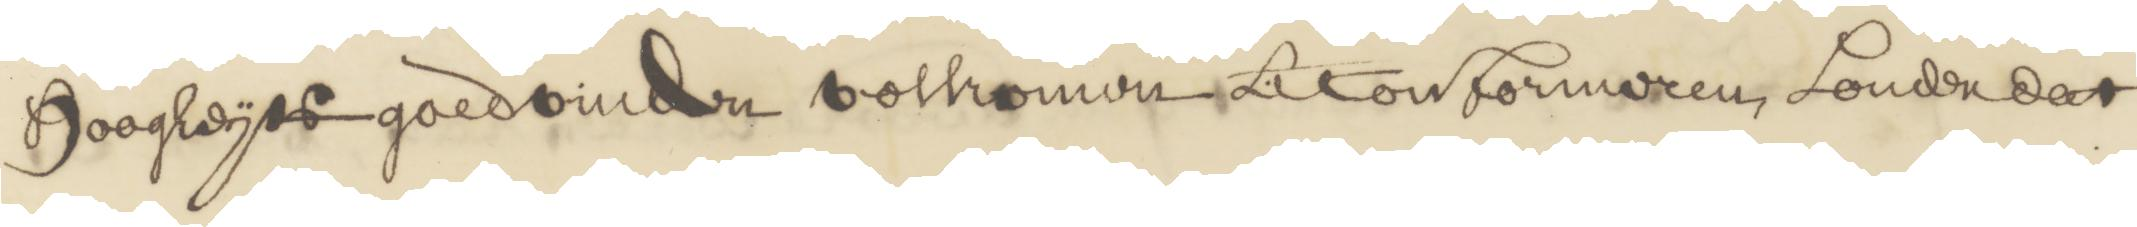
Hoogheijts goedvinden volkomen te conformeren Sonder dat
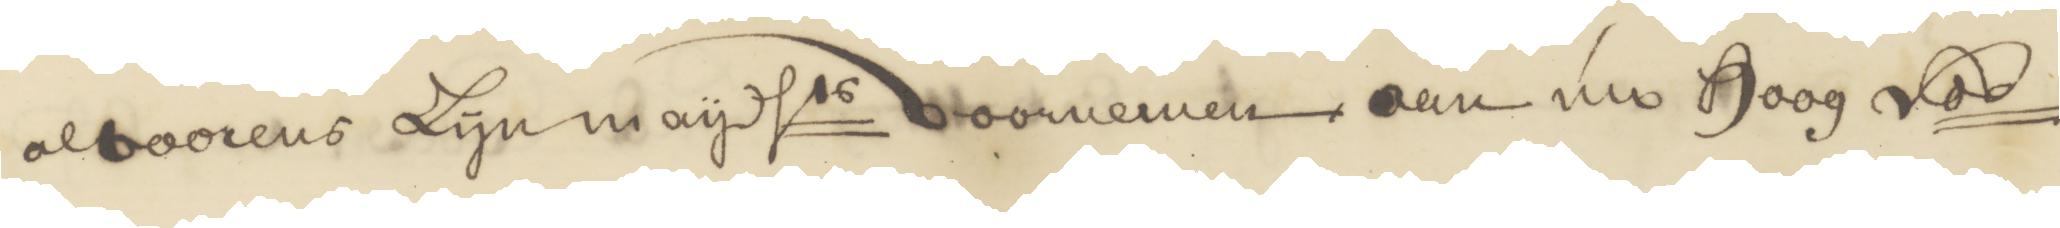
alvoorens Zijn maijes=ts voornemen aan uw Hoog Ed=e
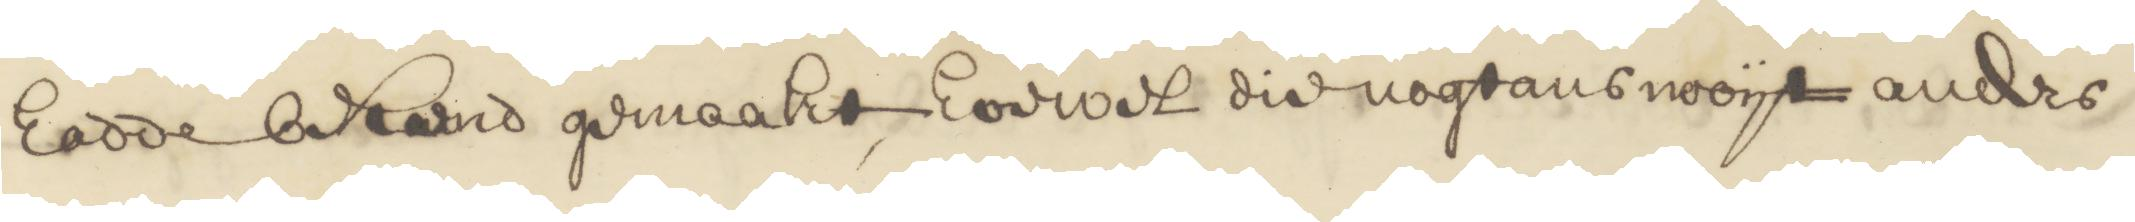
hadde bekend gemaakt, hoewel die nogtans nooijt anders
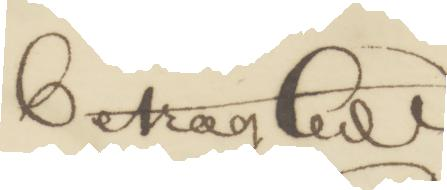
betragte de
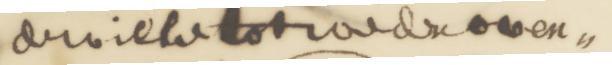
de wille tot weder over„
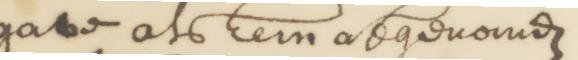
gave als hem afgenomen
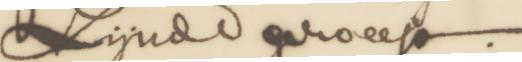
Zijnde geweest.
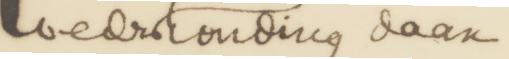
wederhouding daar
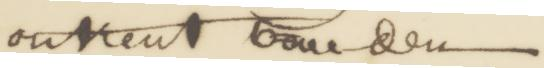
ontrent van den
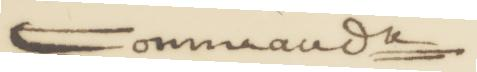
Command=r
